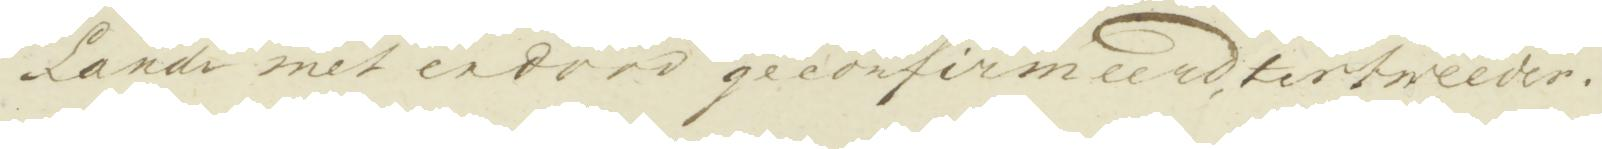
Lands met er dood geconfirmeerd, ter tweeder.
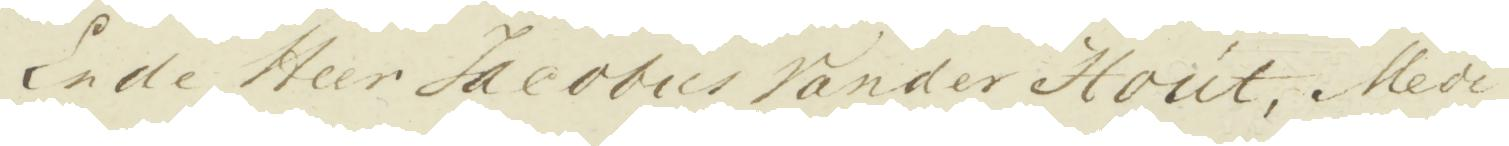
Ende Heer Jacobus Vander Hout, Medi
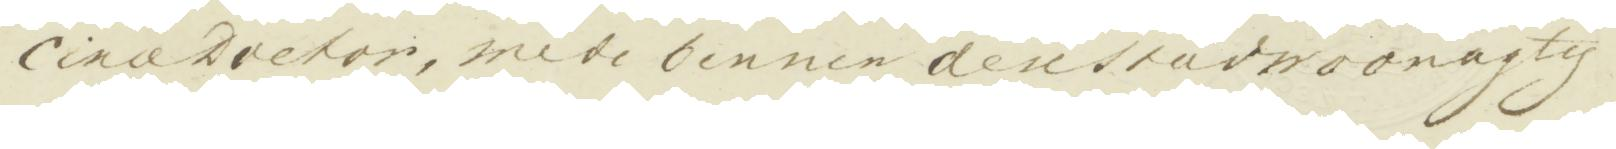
cinae Doctor, mede binnen den stad woonagtig
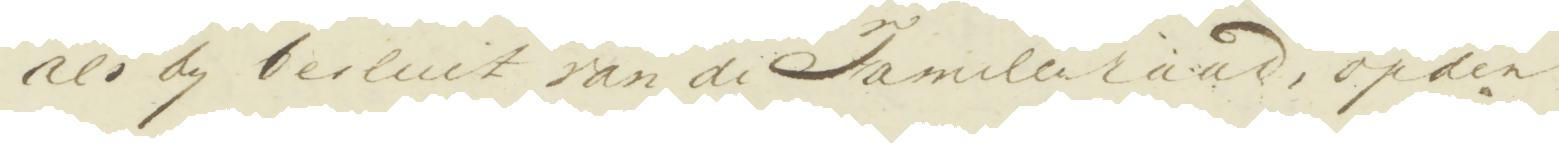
als by besluit van de Familieraad, op den
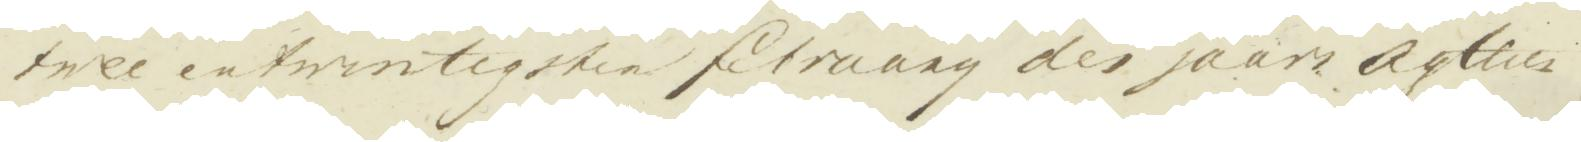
twee en twintigsten february des jaars agttien
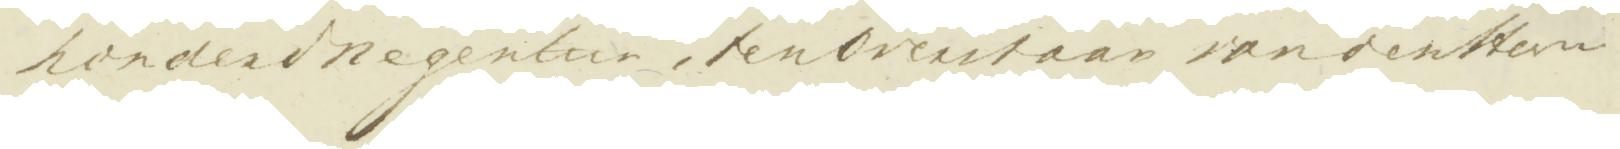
honderdnegentien, ten overstaan van den Heer
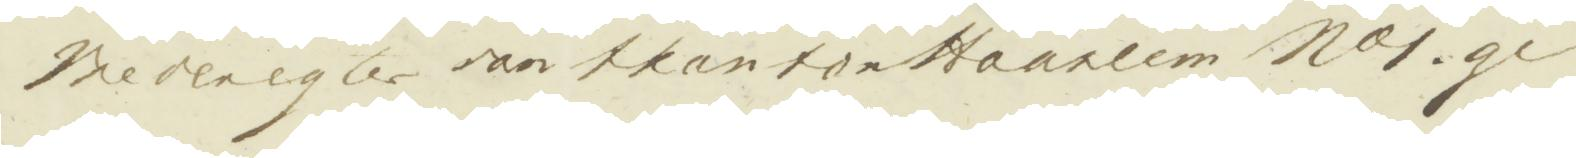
Vrederegter van t kanton Haarlem No 1. ge
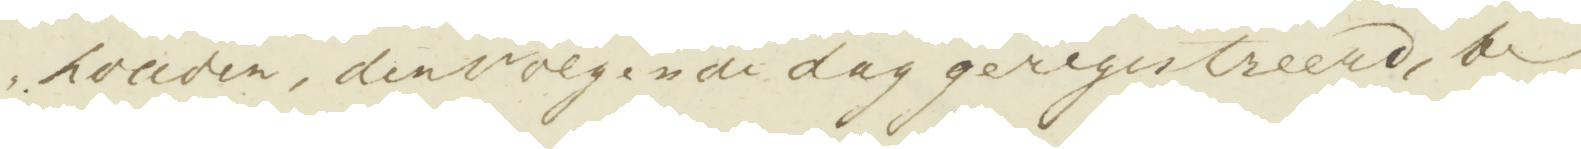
„houden, den volgende dag geregistreerd, be
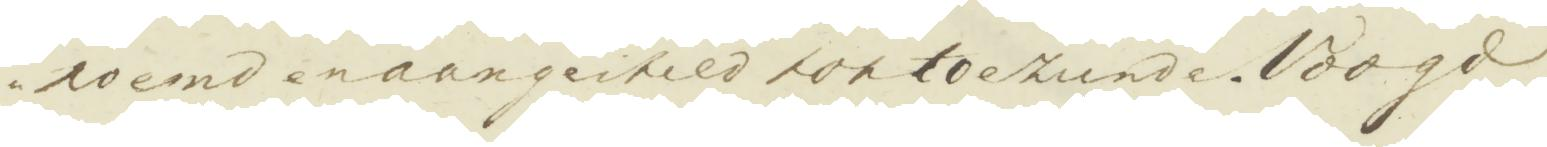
„noemd en aangesteld tot toeziende. Voogd
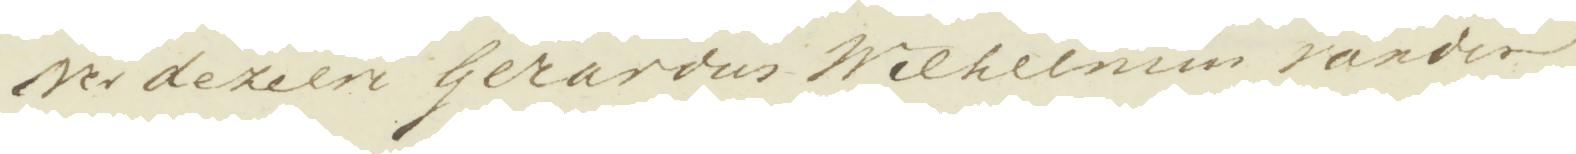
over dezelve Gerardus Wilhelmus vander
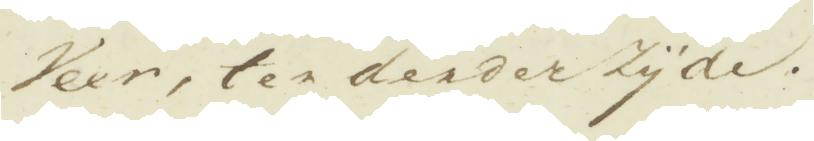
Veer, ten derder zijde.
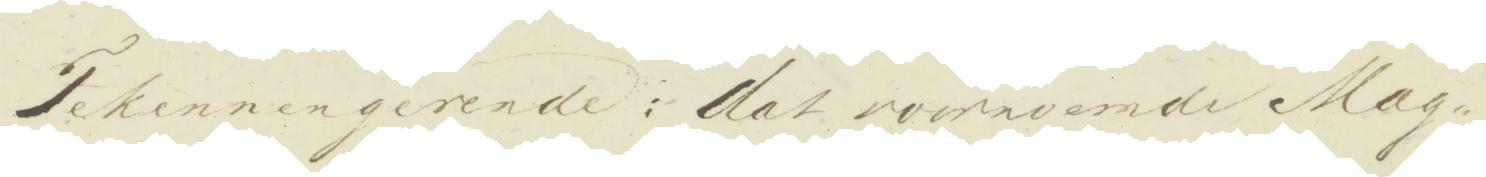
Te kennen gevende: dat voornoemde Mag„
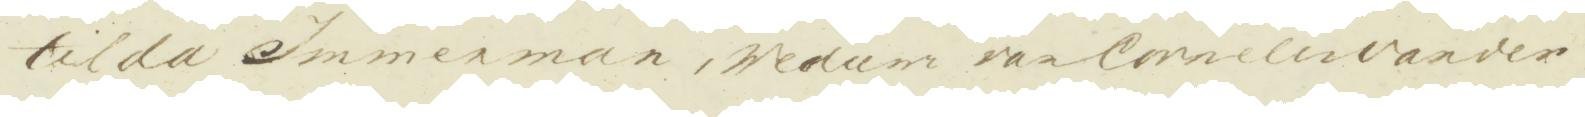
tilda Immerman, weduwe van Cornelis van der
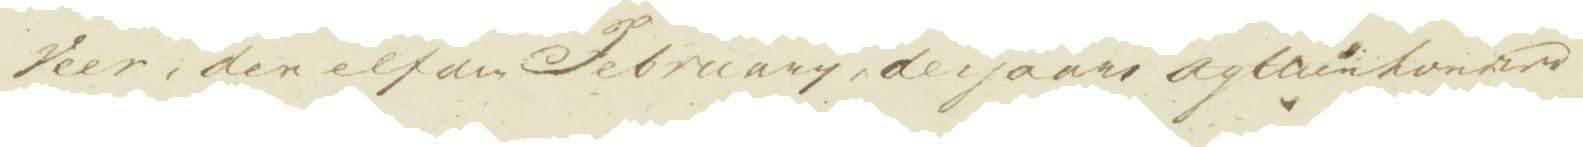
Veer, der elfden February, des jaars agttienhonderd
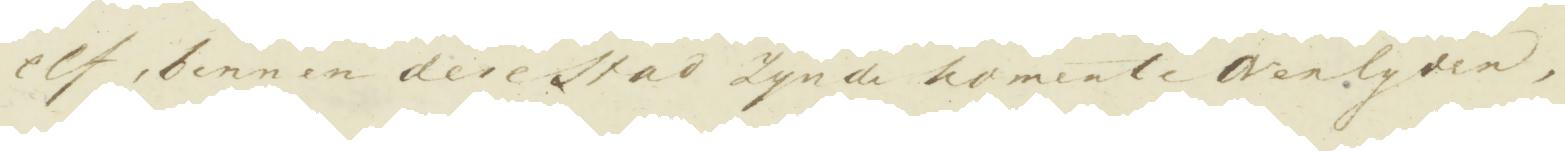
elf, binnen dese stad zynde komente overlyden,
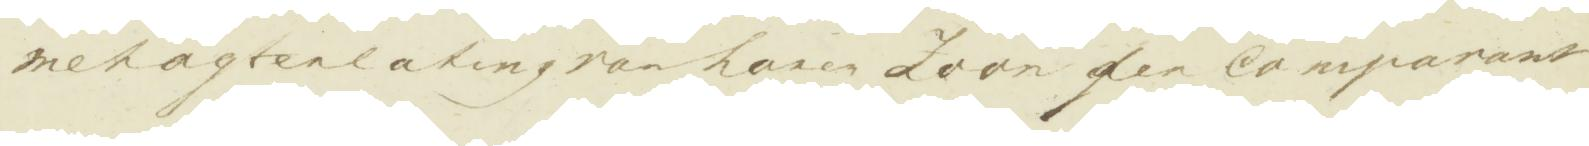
met agterlating van haren Zoon den comparant
